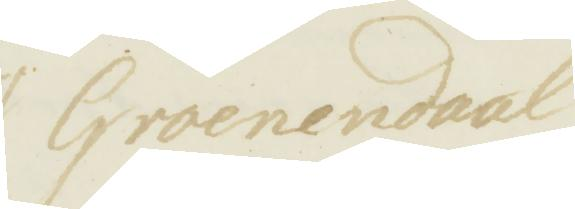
Groenendaal
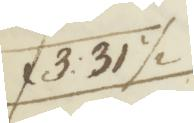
ƒ3:31½
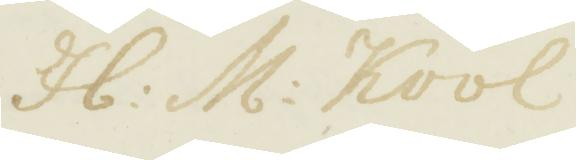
H: M: Kool
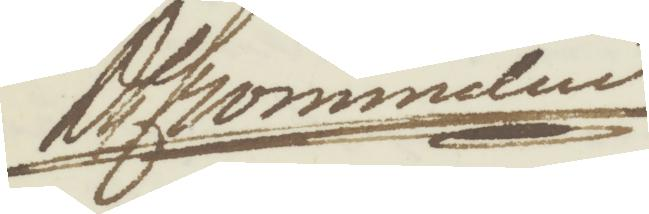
d„f Crommelin
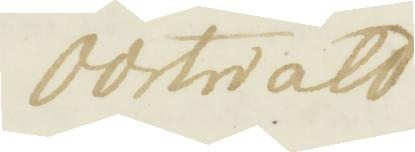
Oostwald
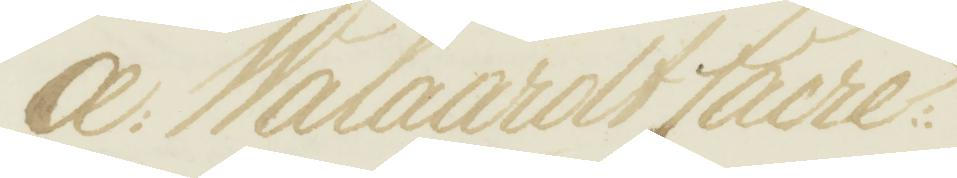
A: Walaardt Sacre:.
